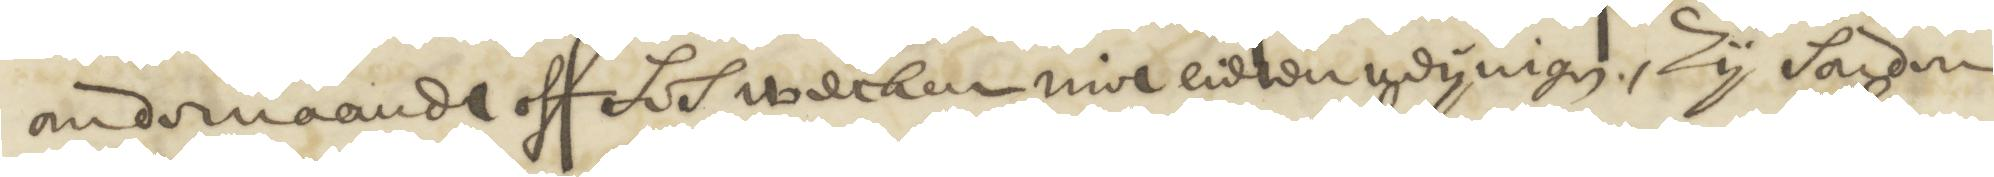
om de maandt off ses wecken niet lieten reijnigen, zij souden
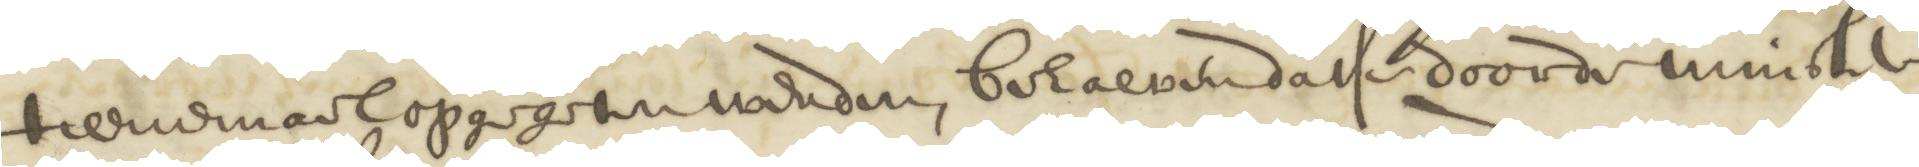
teenemael op gegeten werden, behalven datse door de minste
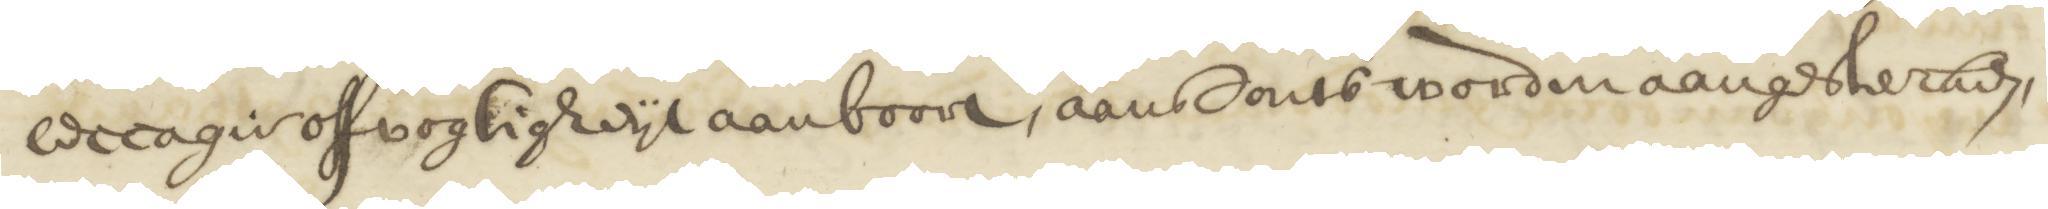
leccagie off vogtigheijt aanboort, aanstonts worden aangesteecken,
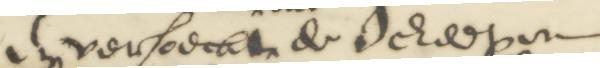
en versoeckt dat de scheepen
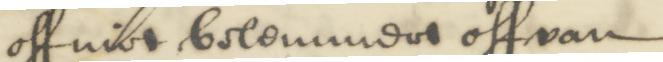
off niet belemmert off van
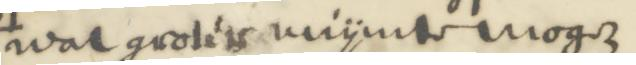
wat groter ruijmte mogen
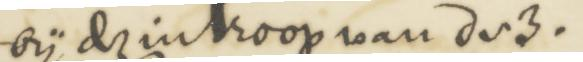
bij den inkoop van de 3.
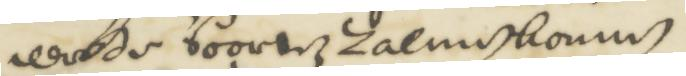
eer de soorten zal men konnen
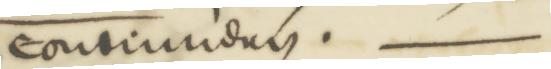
continueren. —
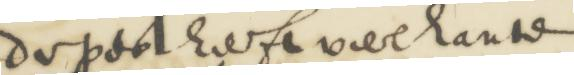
de pest heeft veel harte
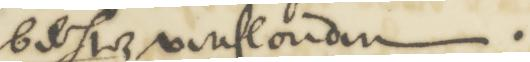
beesten verslonden.
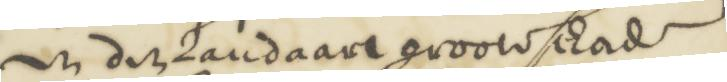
en den Landaart groote schade
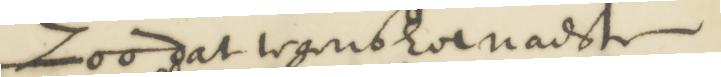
Zoo dat tegens het naeste
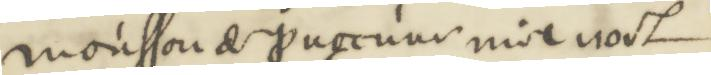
mousson de procure niet noet
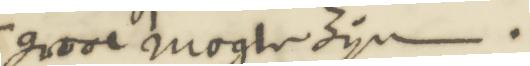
groot mogte zijn.
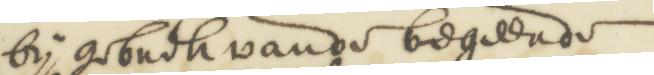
bij gebrek van de begeerde
